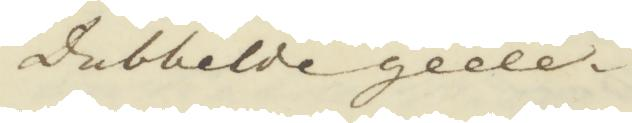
Dubbelde geele
